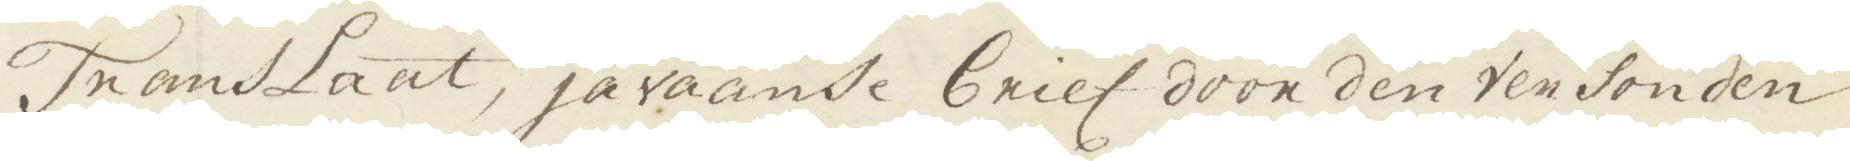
Translaat, javaanse brief door den versonden
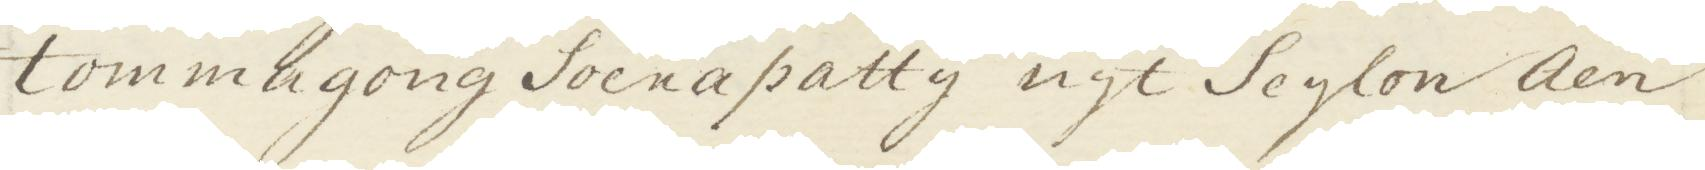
tommagong soerapattij uijt Seijlon aen
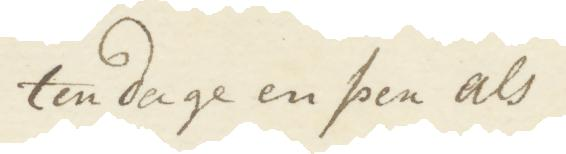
ten dage en per als
